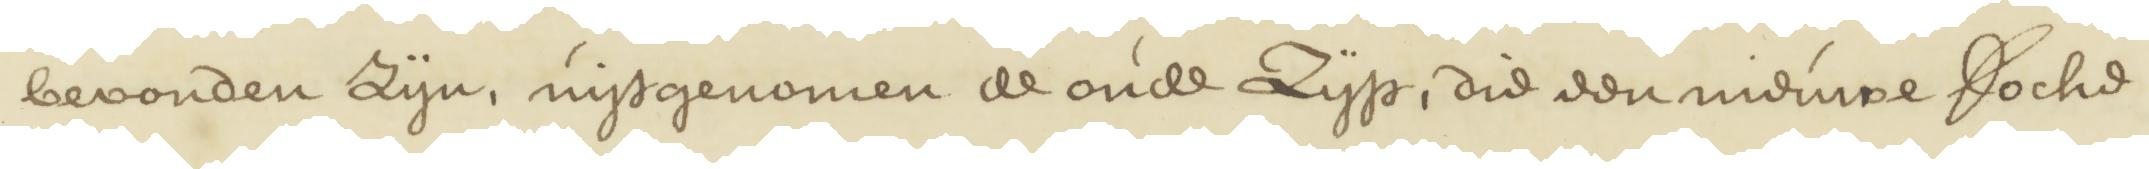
bevonden zijn, uijtgenomen de oude Zijp, die een nieuwe focke
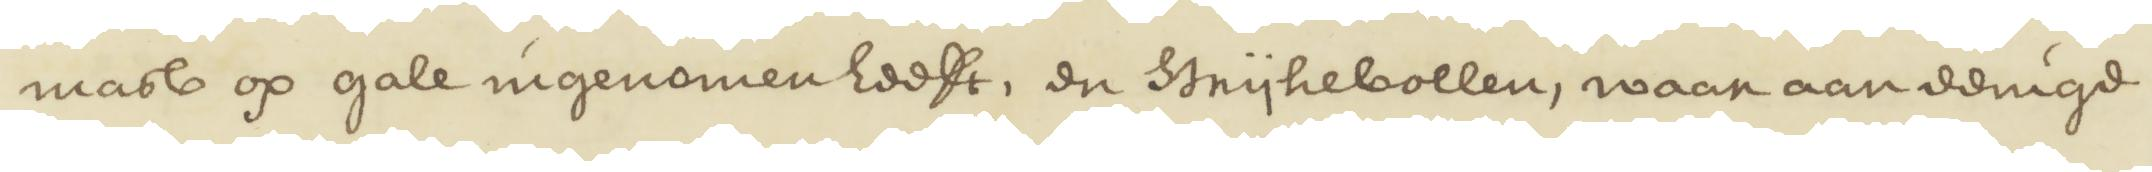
mast op gale ingenomen heeft, en strijkebollen, waar aan eenige
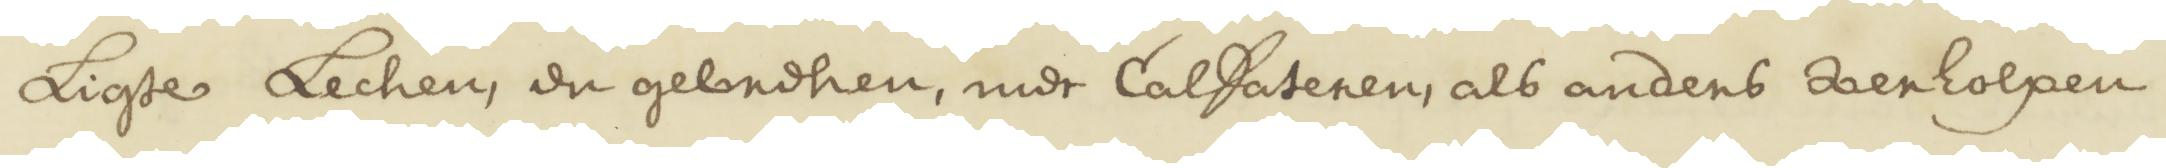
Ligte Lecken, en gebreken, met Calfateren, als anders verholpen
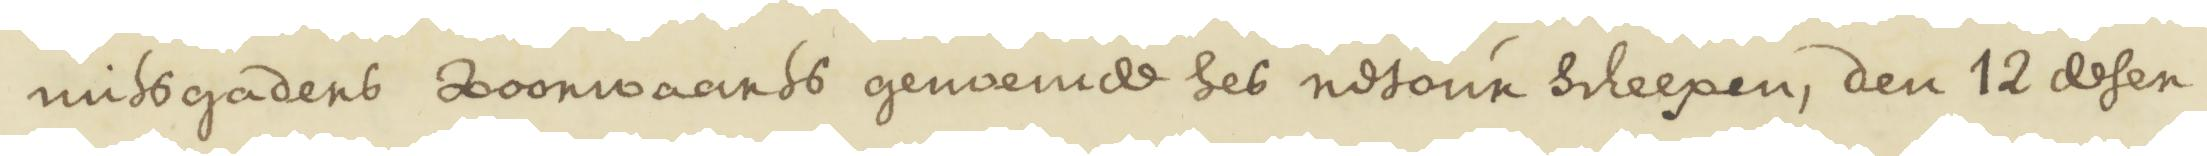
mitsgaders voorwaarts genoemde ses retour scheepen, den 12 deser
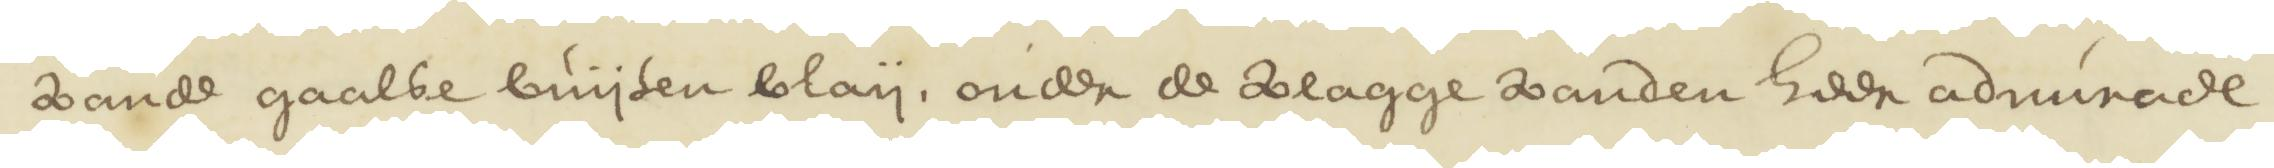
vande gaalse buijten bhaij, onder de vlagge van den heer admirael
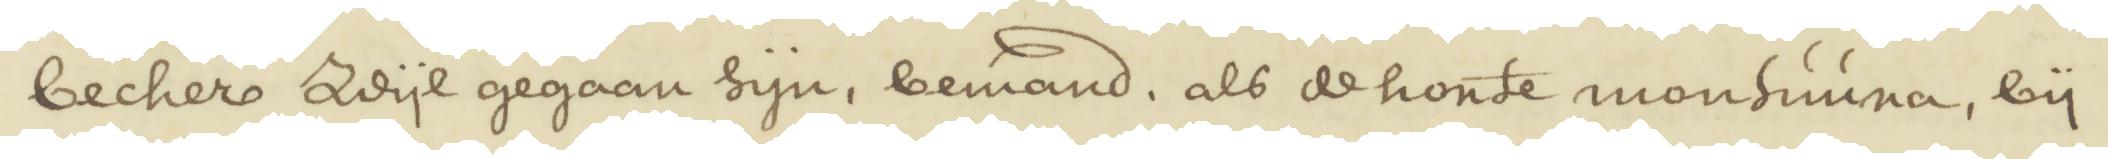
becker zeijl gegaan sijn, bemand, als de korte monsuura, bij
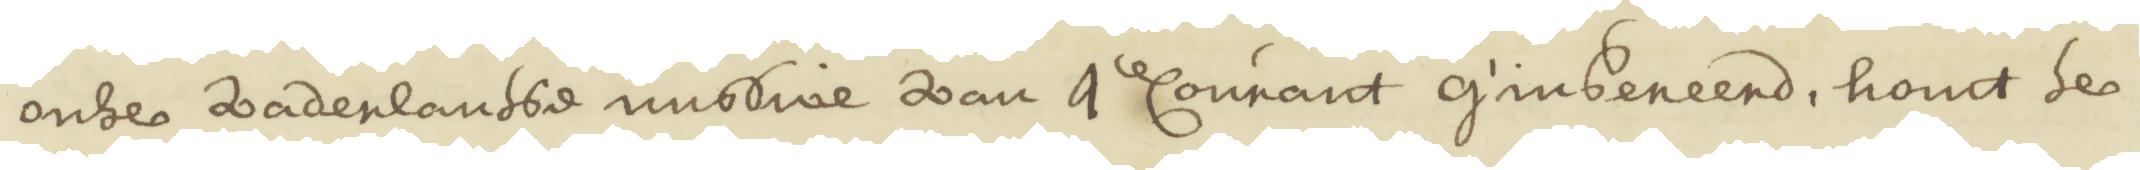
onse vaderlandse missive van 4 Courant g’insereerd, komt te
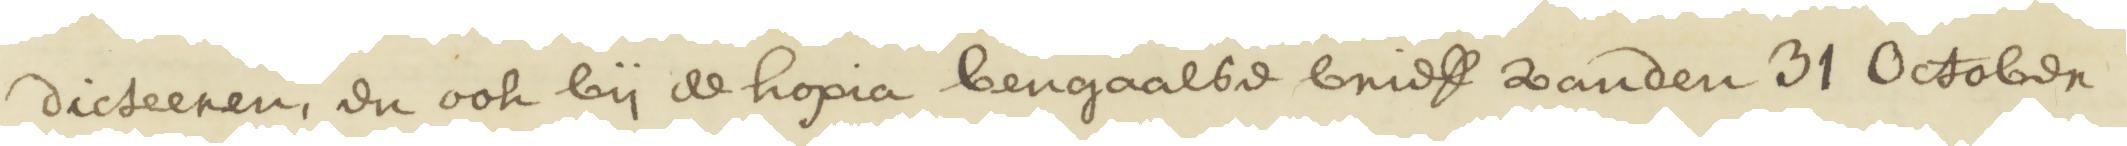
dicteeren, en ook bij de kopia bengaalse brief van den 31 October
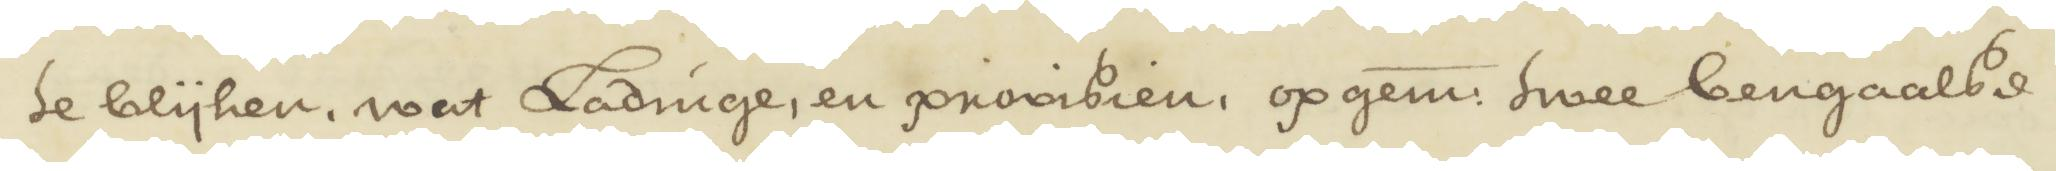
te blijken, wat Ladinge, en provisien, op gem: twee bengaalse
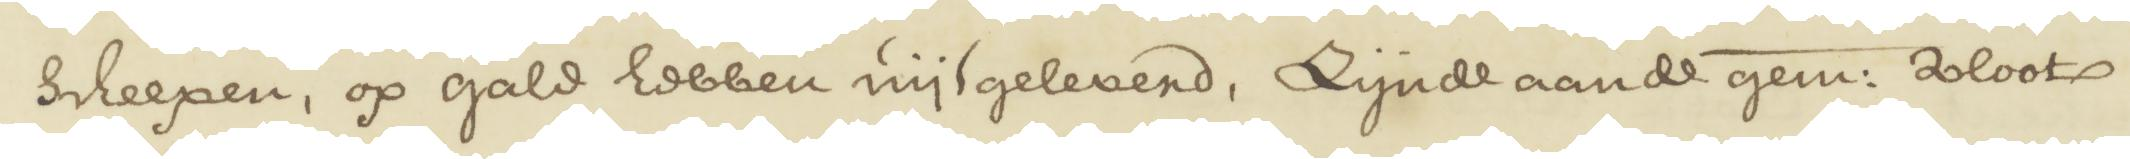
scheepen, op gale hebben uijtgeleverd, zijnde aan de gem: vloot
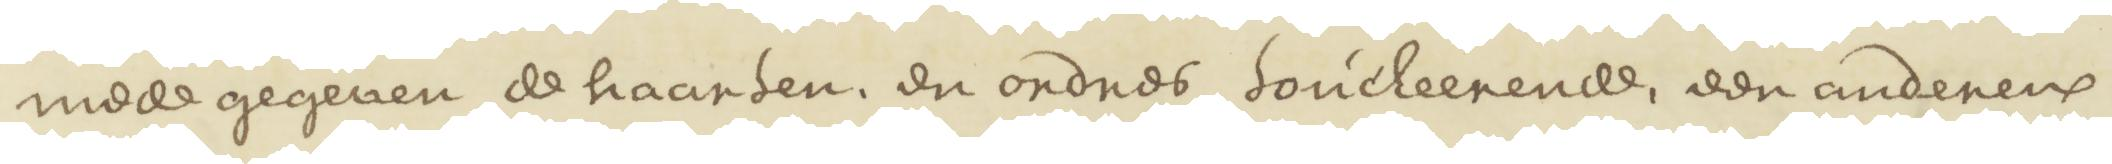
mede gegeven de kaarsen, en ordres toucheerende, een anderen
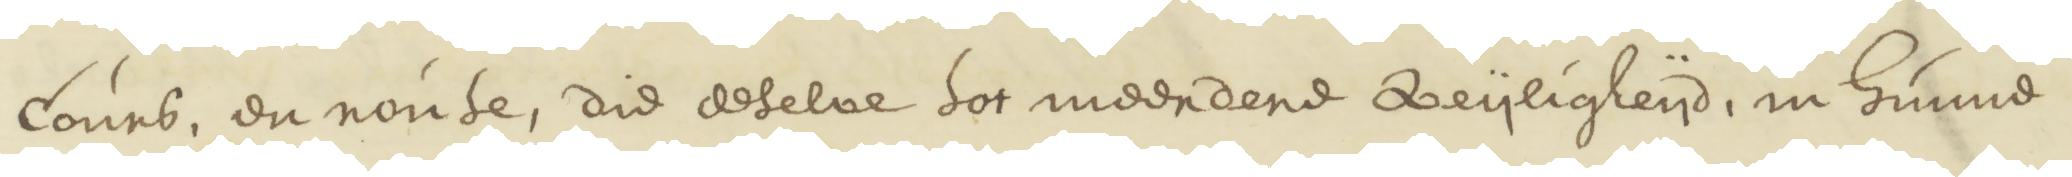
cours, en route, die deselve tot meerdere veijligheijd, in hunne
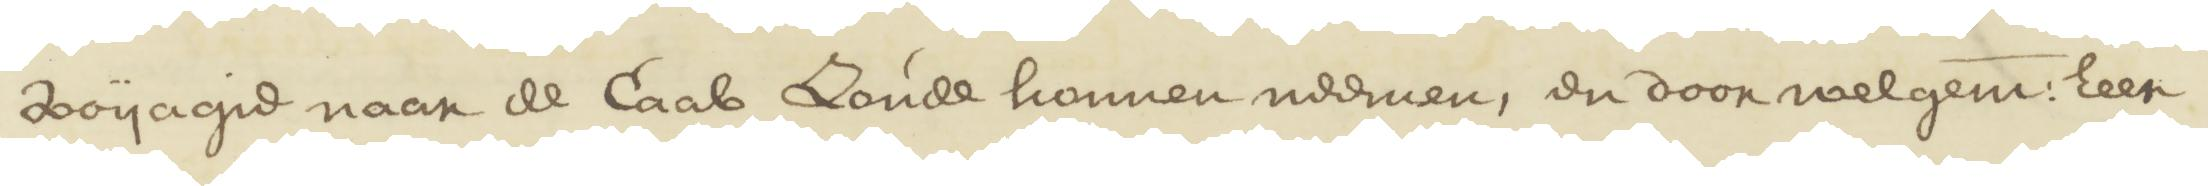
voijagie naar de Caab zoude konnen neemen, en door wel gem: heer
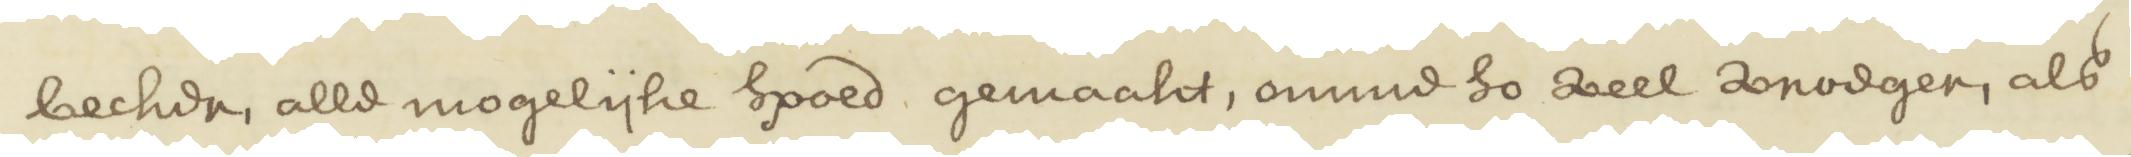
becker, alle mogelijke spoed gemaakt, omme so veel vroeger, als
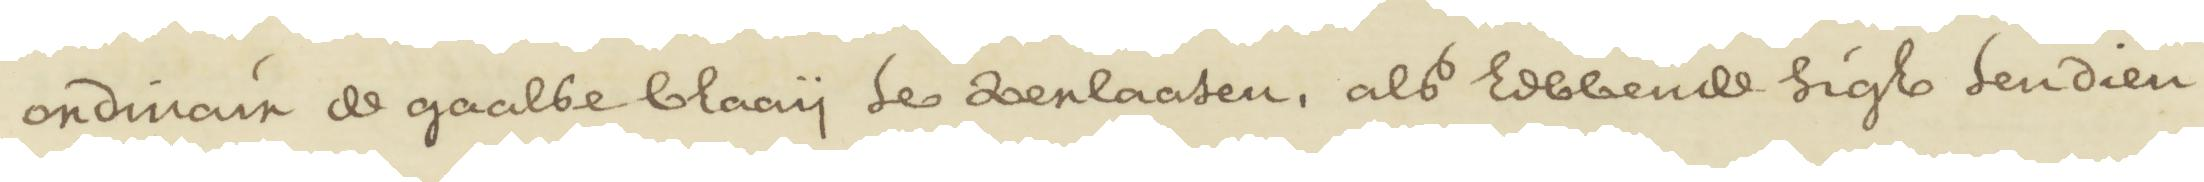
ordinair de gaalse bhaaij te verlaaten, als hebbende sigh ten dien
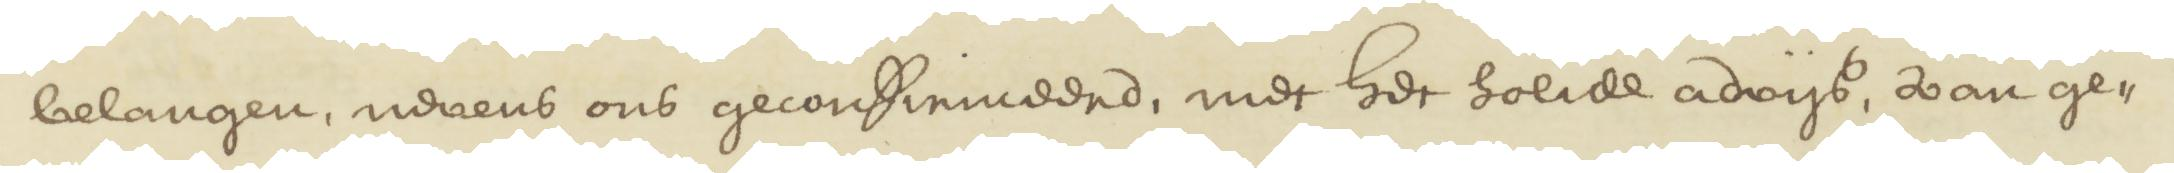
belangen, nevens ons geconfirmeerd, met het solide advijs, van ge„
